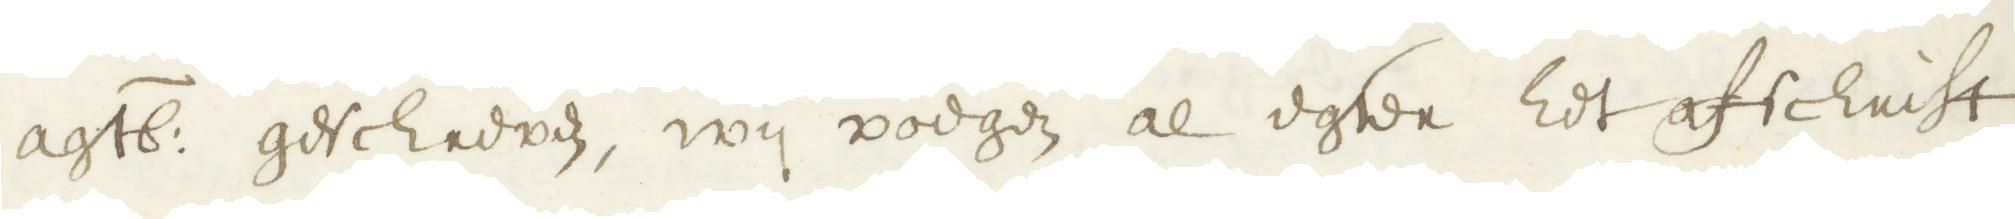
agtb: geschreven, wij voegen al egter het afschrift
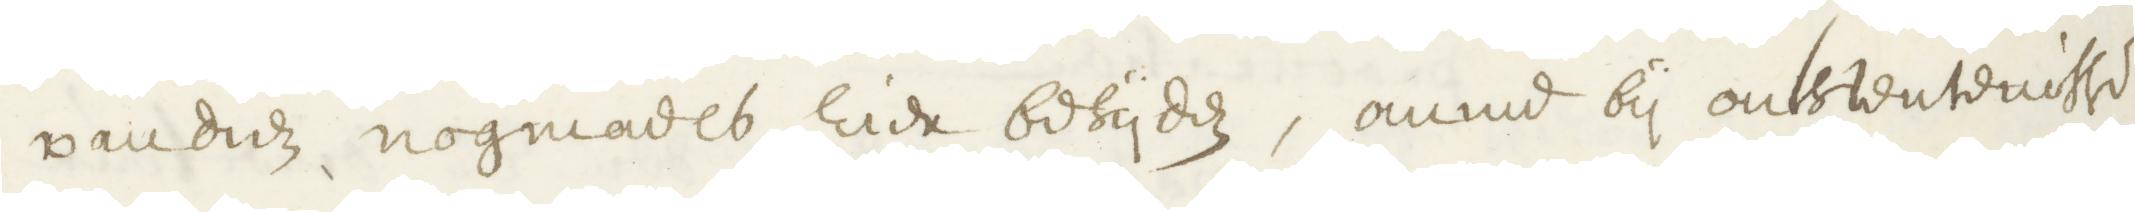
van dien nogmaels hier besijden, omme bij ontstentenisse
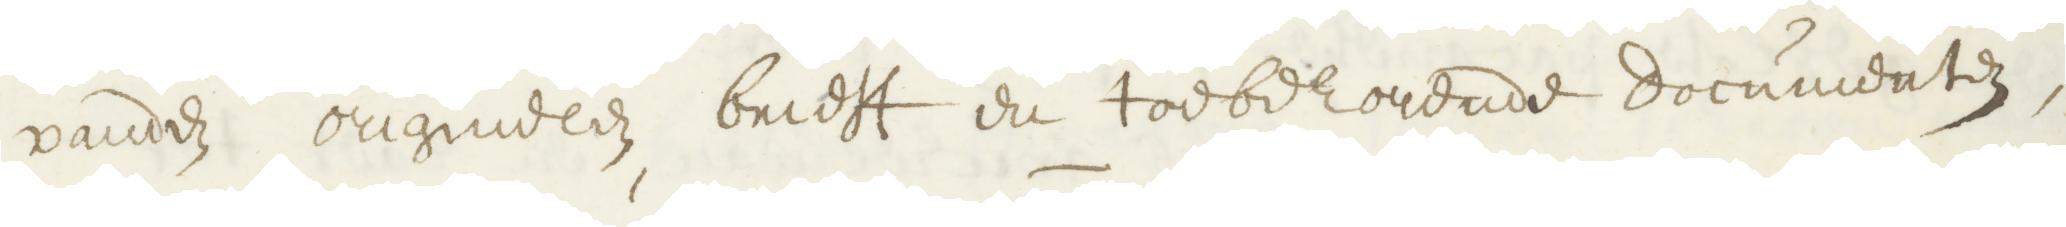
vanden originelen brieff en toebehorende documenten,
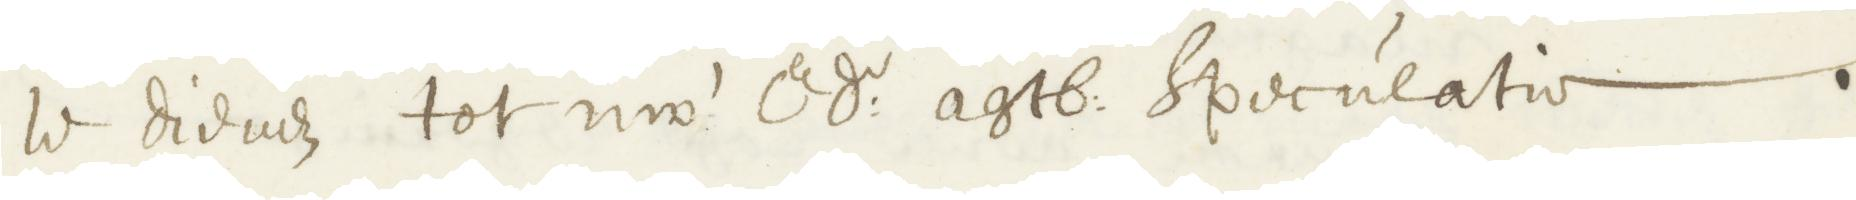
te dienen tot uw: Ed: agtb: speculatie.
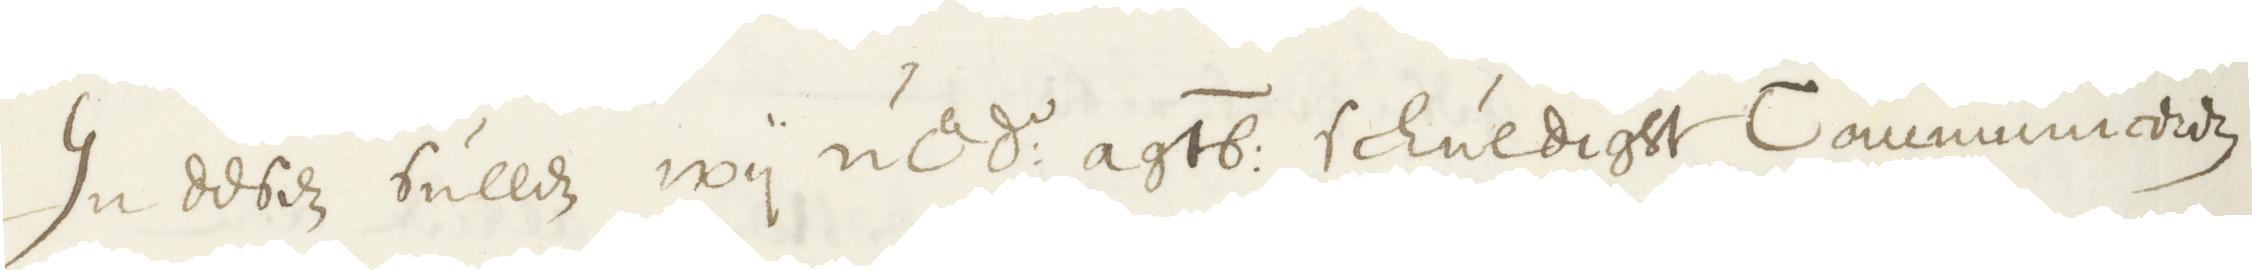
Jn desen sullen wij u Ed:e agtb: schuldigst Communiceren
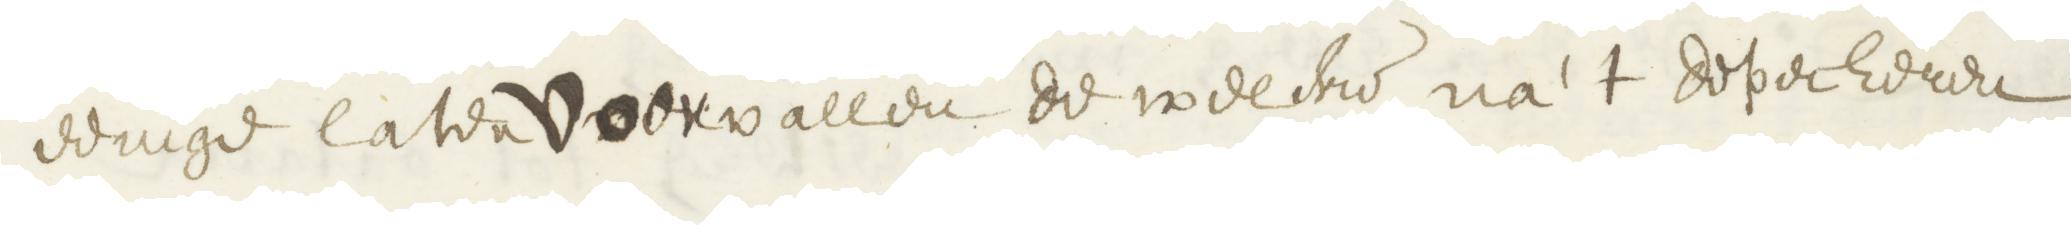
eenige later voorvallen de welcke na ’t depecheren
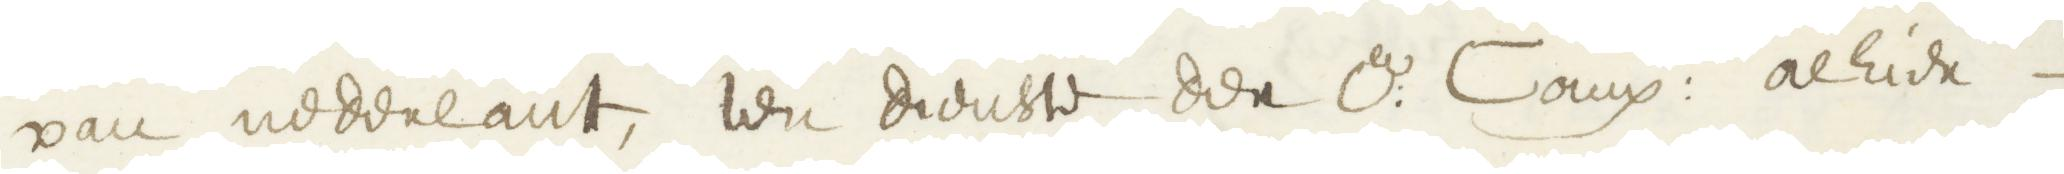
van nederlant, ten dienste der E: Comp:s alhier
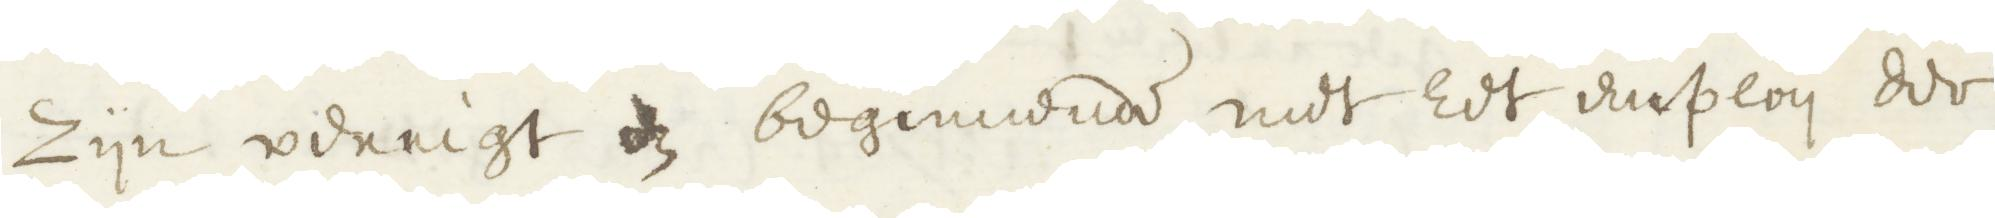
zijn verrigt en beginnende met het emploij der
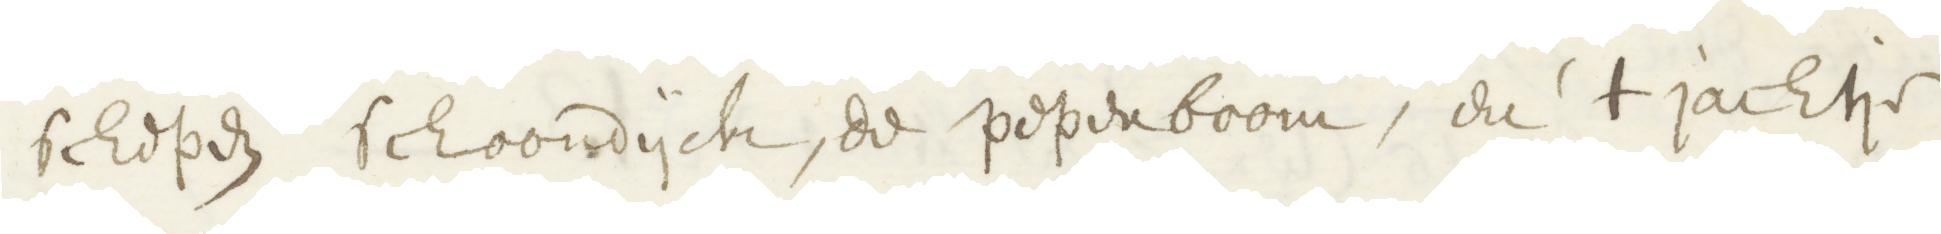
schepen schoondijck, de peperboom, en ’t jachtje
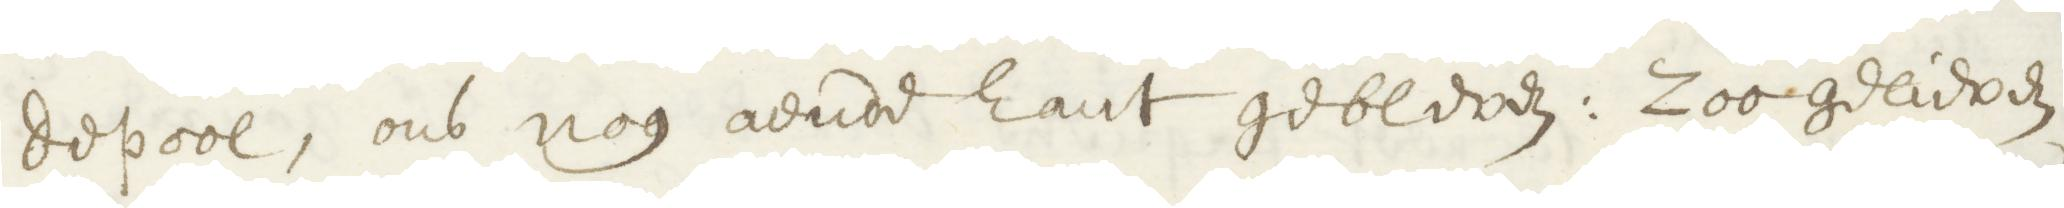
de pool, ons nog aende hant gebleven: zoo gelieven
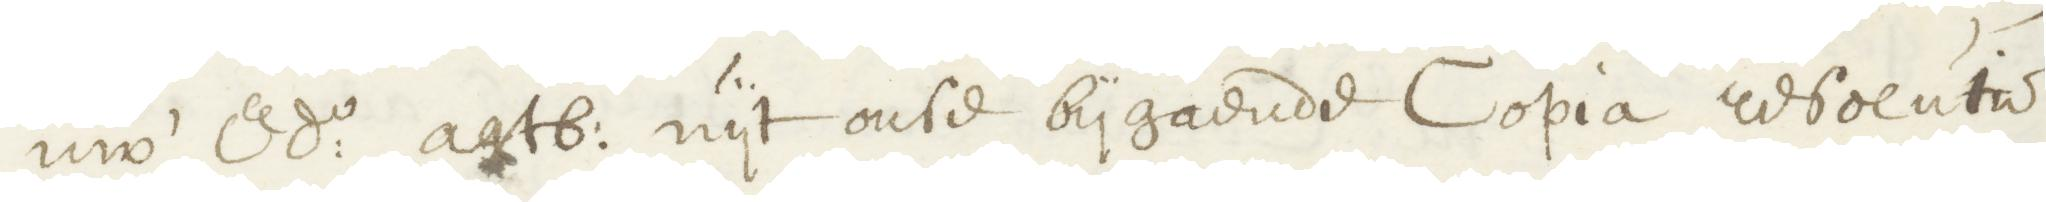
uw' Ed:e agtb: uijt onse bijgaende Copia resolutie
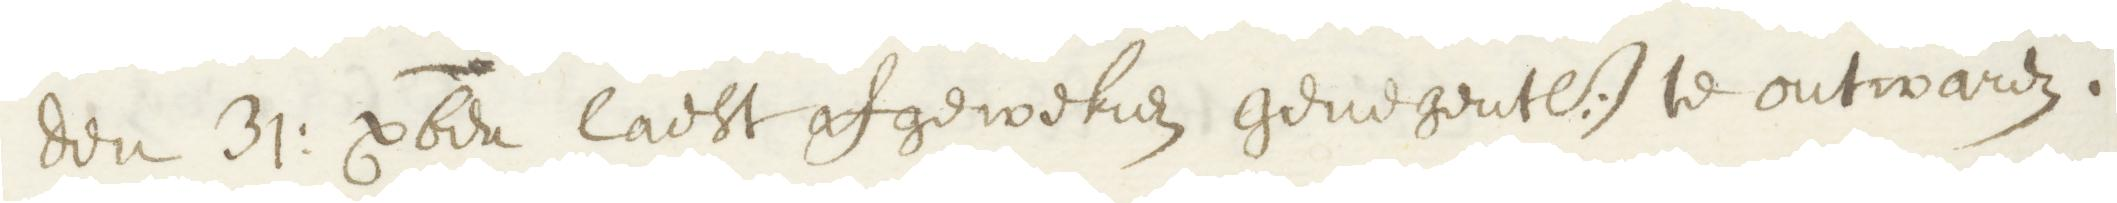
den 31: xber laest afgeweken genegentlijk te ontwaren.
